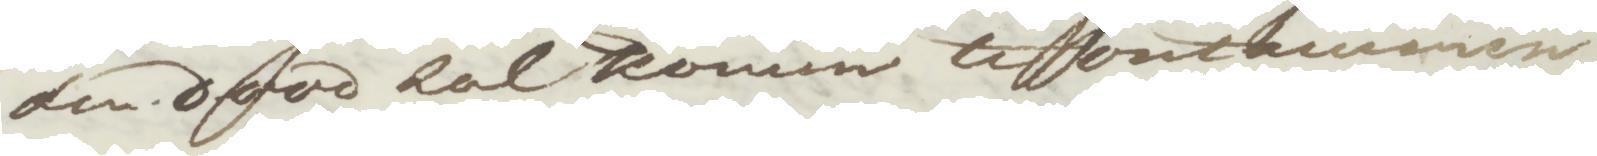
den dood zal komen te ontruimen
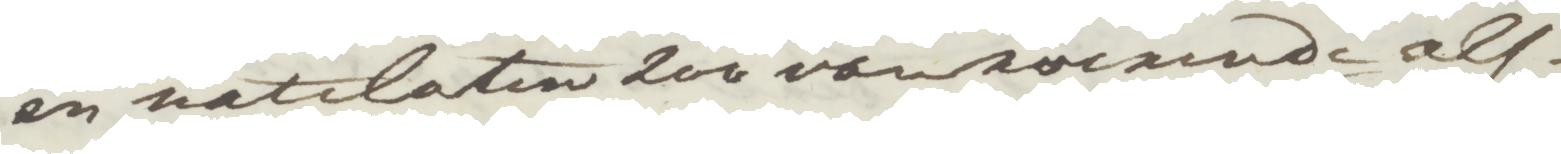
en natelaten zoo van roerende als
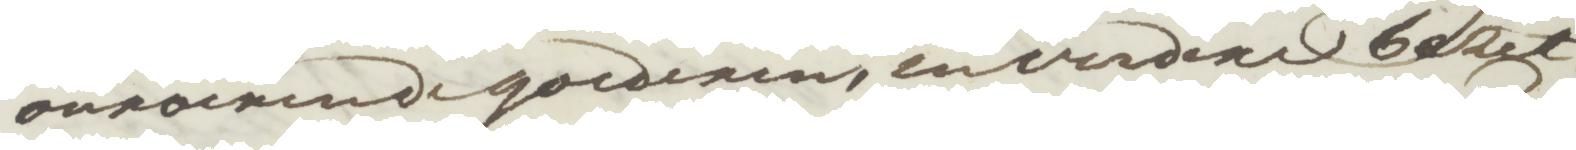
onroerende goederen, en verdere bezit
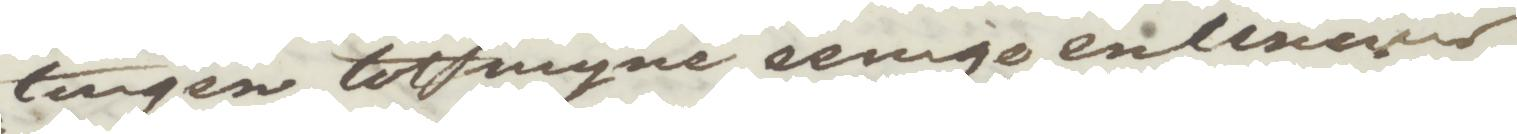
tingen tot myne eenige en univer
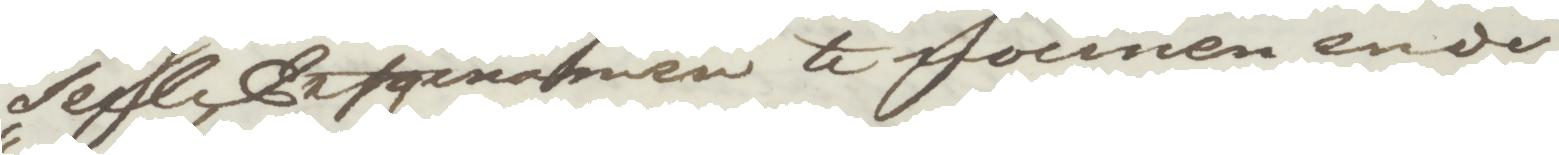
„seele Erfgenamen te noemen ende
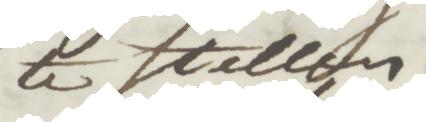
te stellen
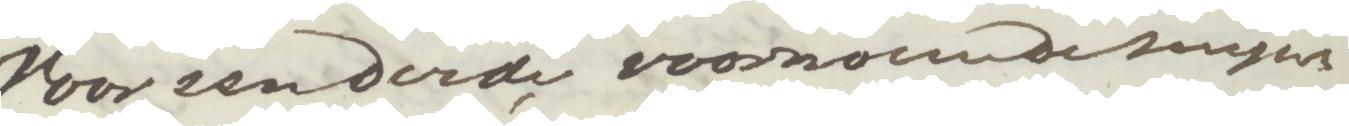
Voor een derde voornoemde myn
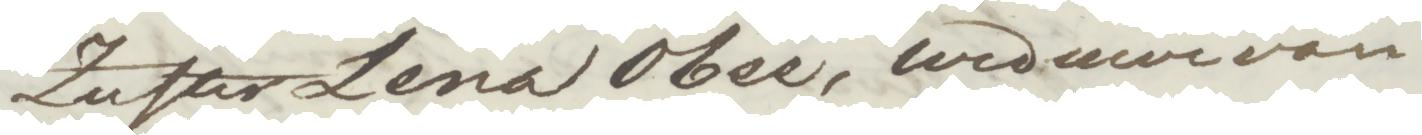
Zuster Lena Obeé, weduwe van
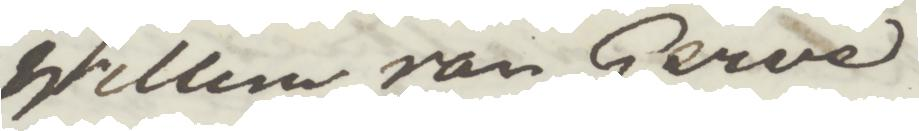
Willem van Gerve
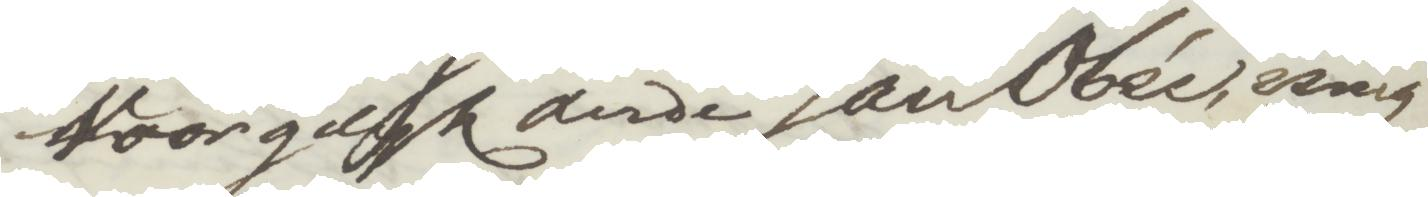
Voor gelyk derde Jan Obée, eenig
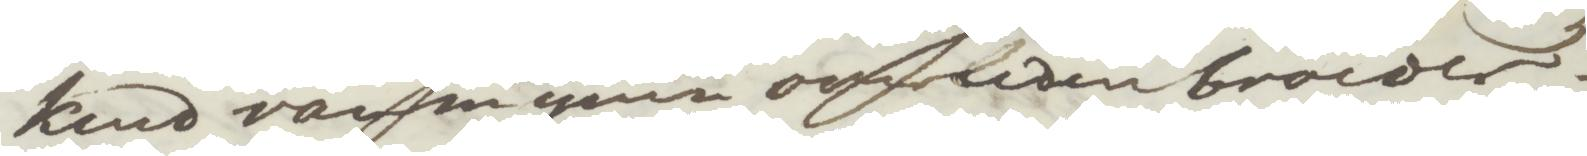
kind van mynen overleden broeder
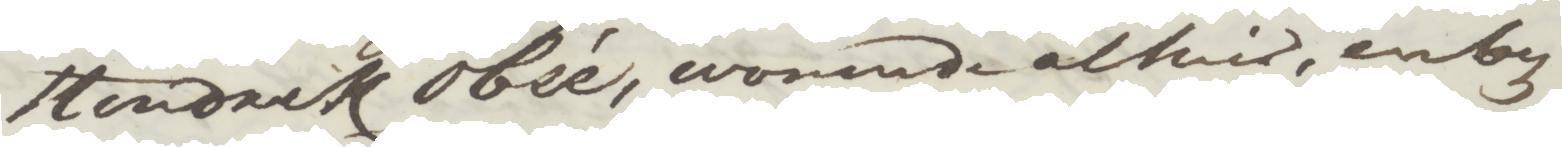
Hendrik Obeé, wonende alhier, en by
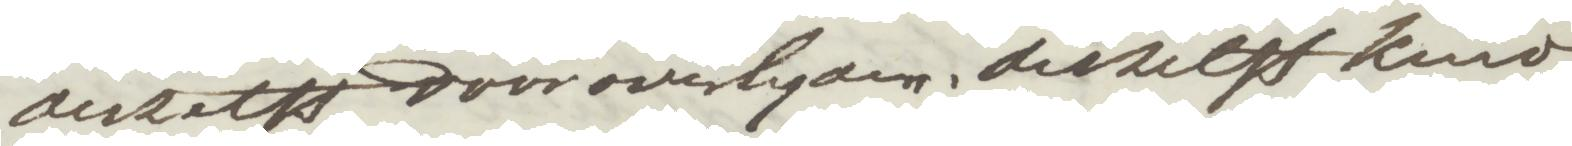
deszelfs door overlyden, deszelfs kind
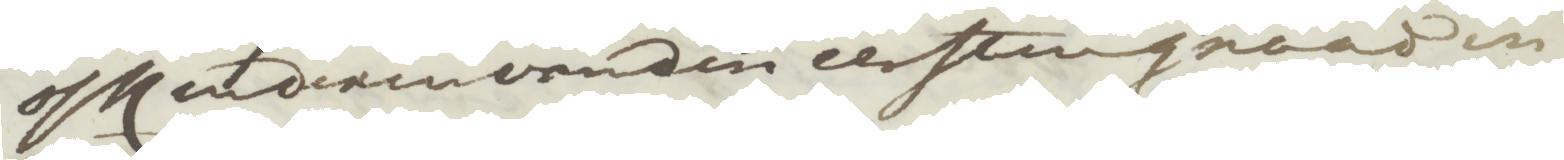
of kinderen van den eersten graad in
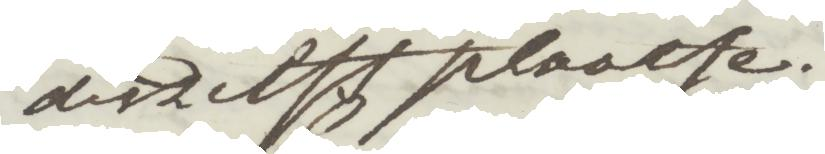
deszelfs plaatse.
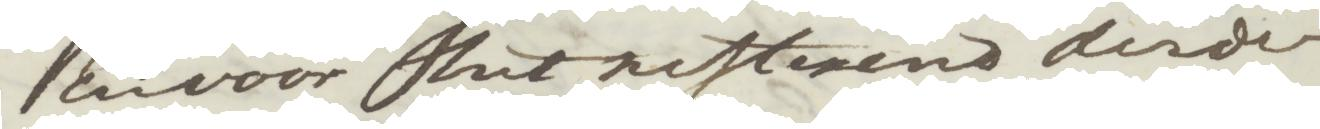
En voor het resterend derde
